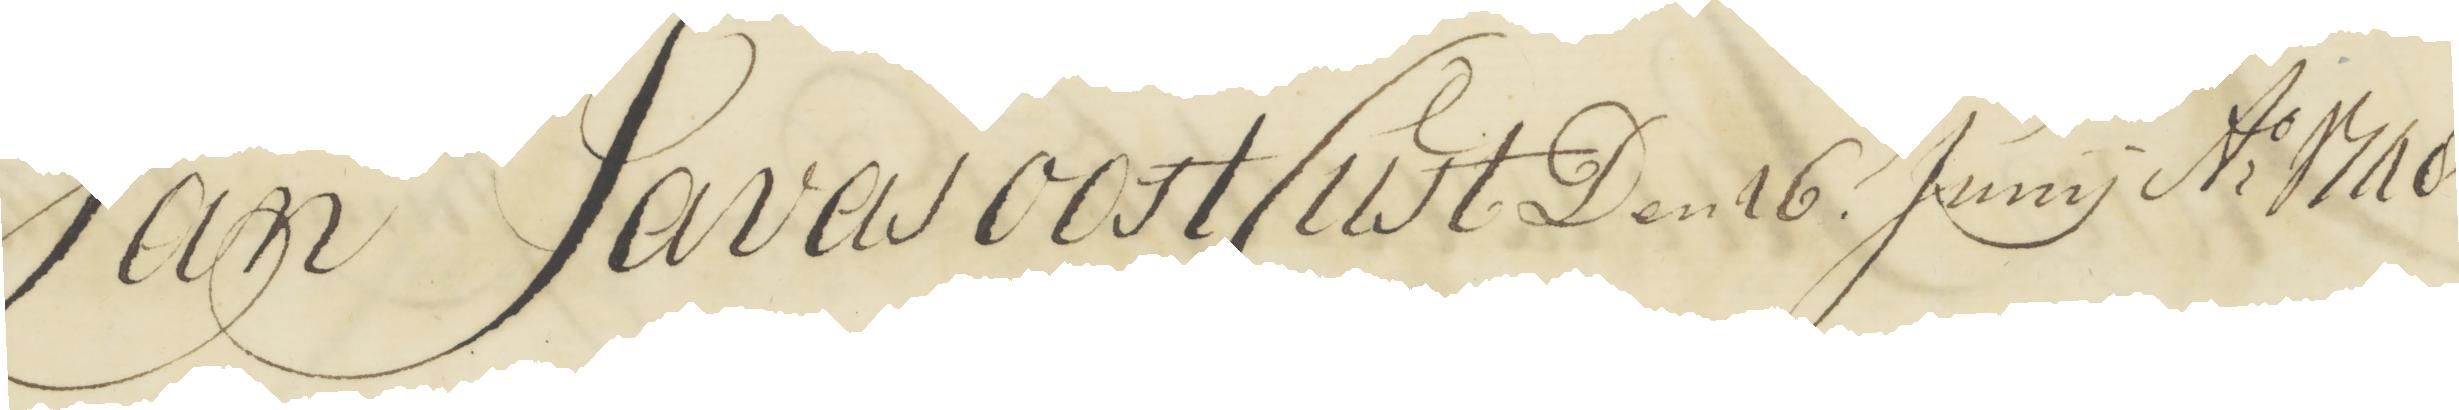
Van Javas oost Cust Den 16.' Junij A:o 1748
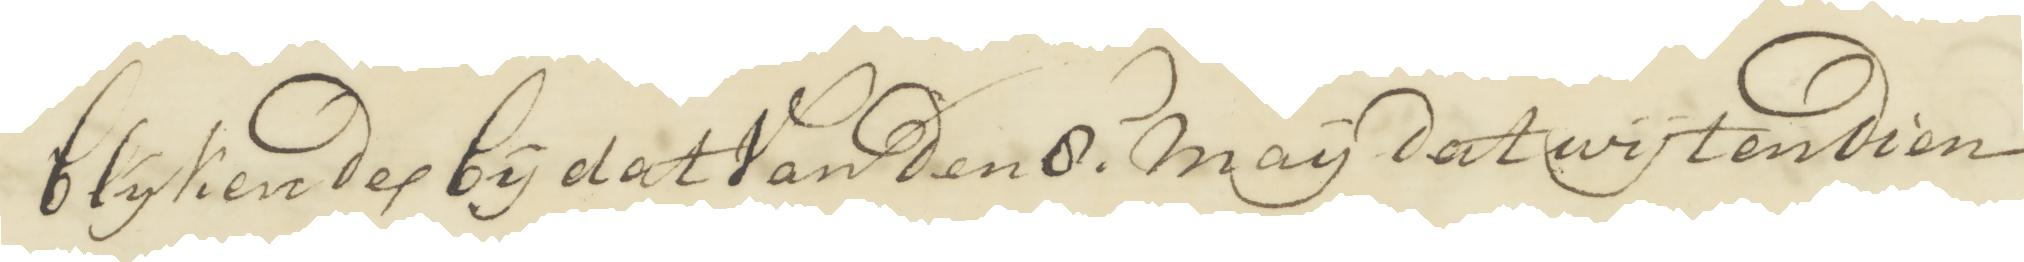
blijken de bij dat van den 8.' maij dat wij ten dien
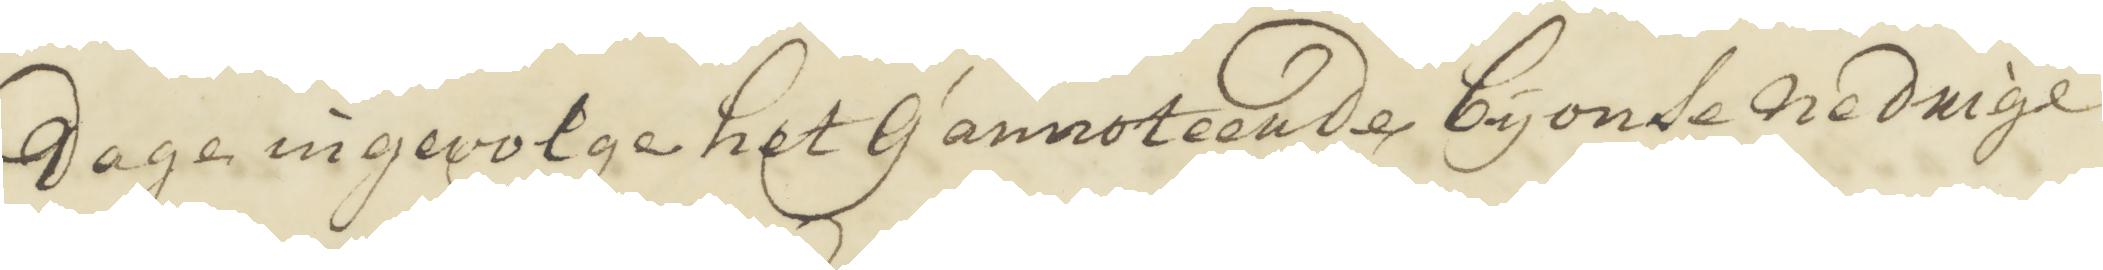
dage ingevolge het g’annoteerde bij onse nedrige
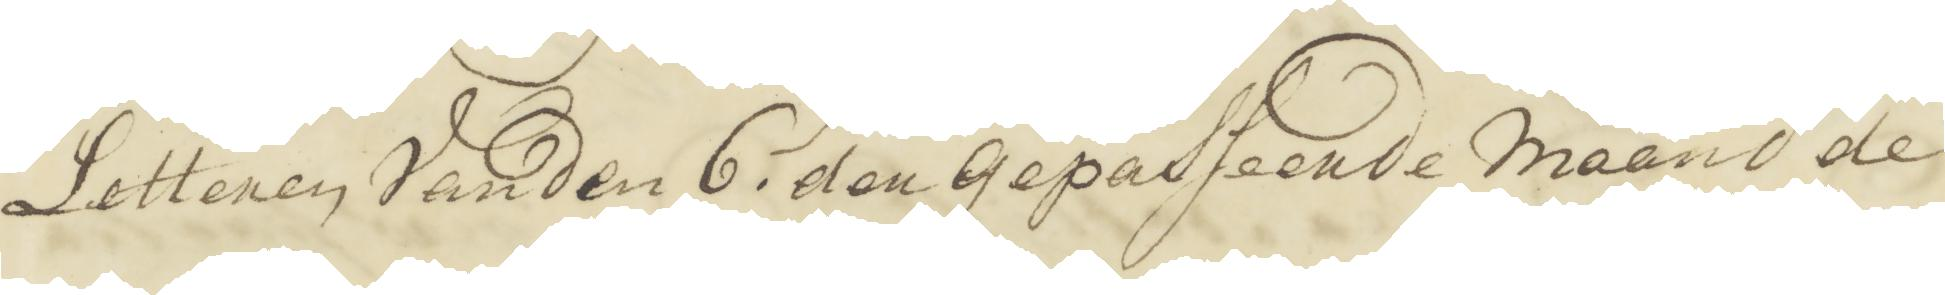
Letteren van den 6.' den gepasseerde maand de
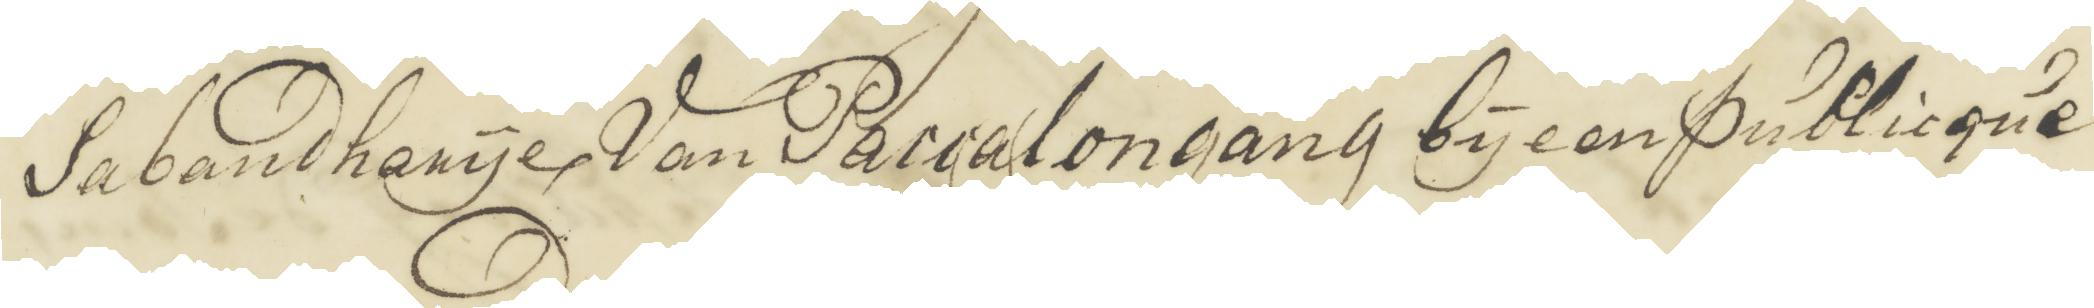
Sabandharije van Paccalongang bij een publicque
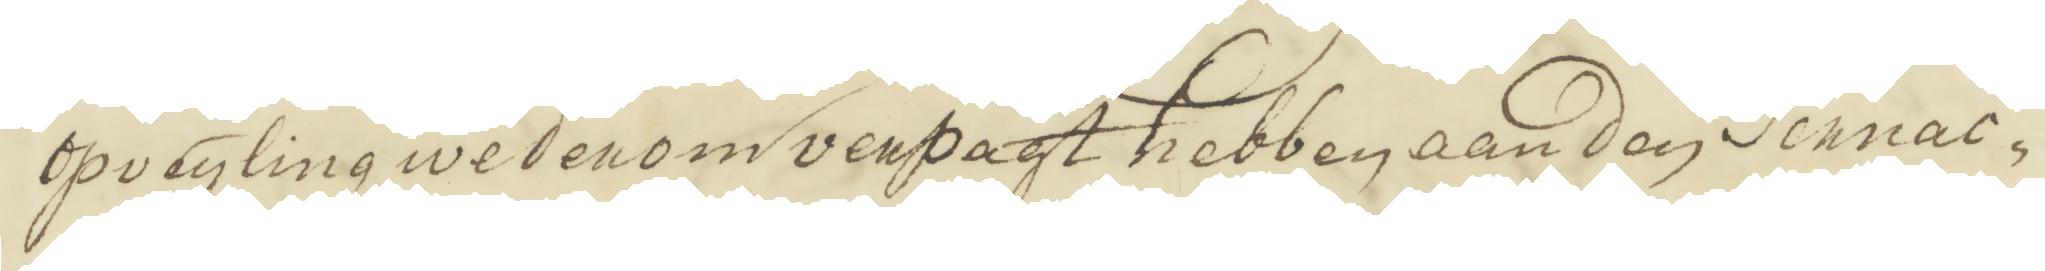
opveijling wederom verpagt hebben aan den Pernac„
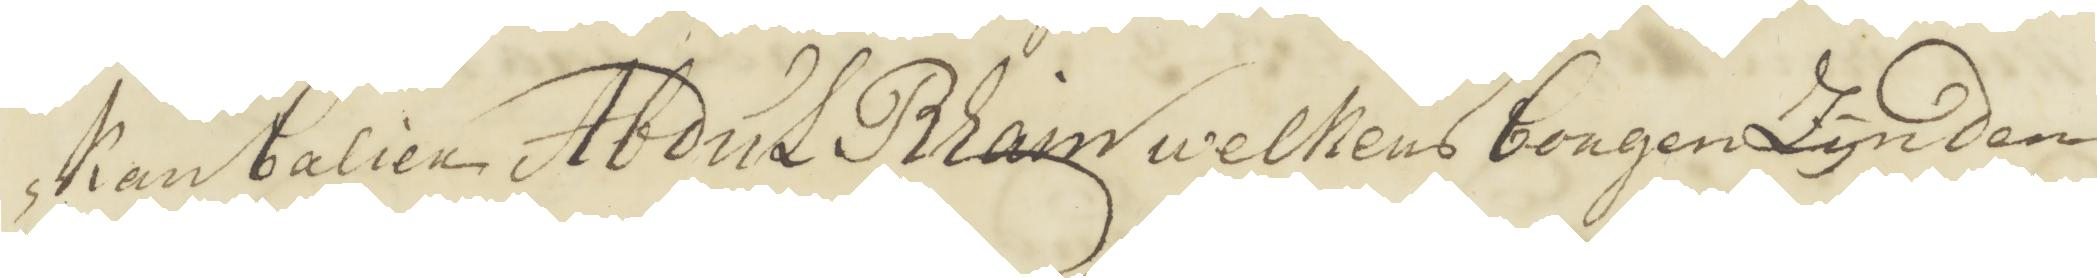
„kan balier Abdul Rhain welkens borgen zijn den
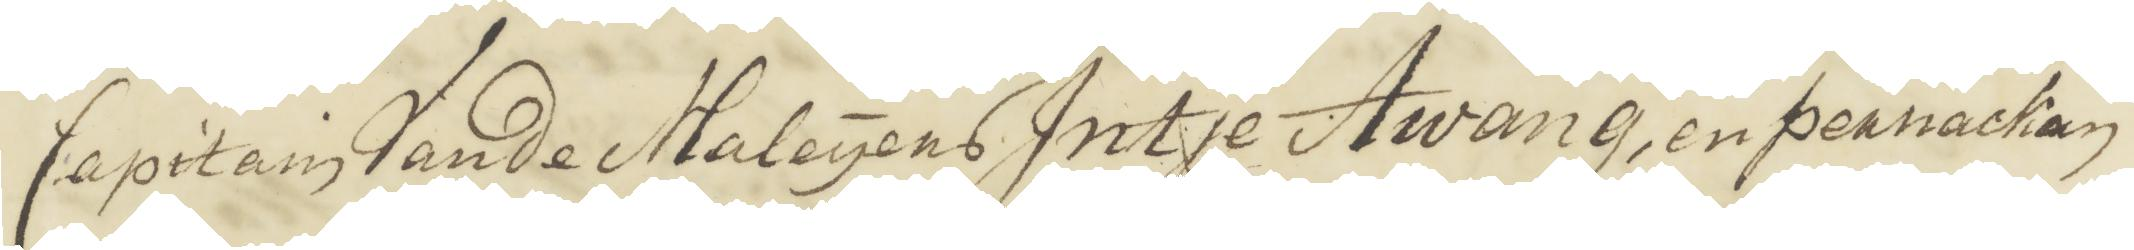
Capitain Van de Maleijens Jntje Awang, en pernackan
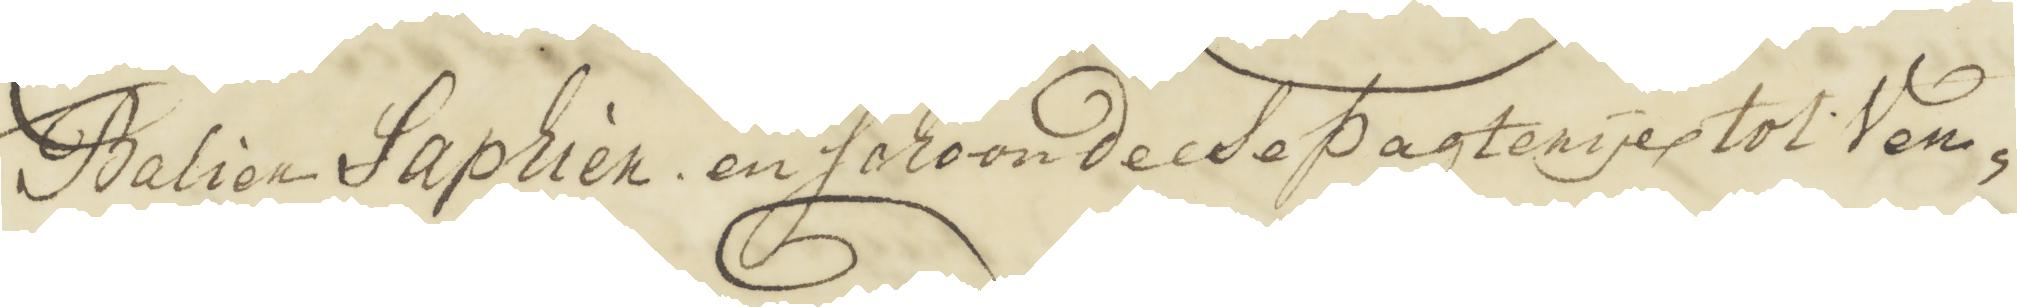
Balier Saphier en schoon deese pagterije tot Ver„
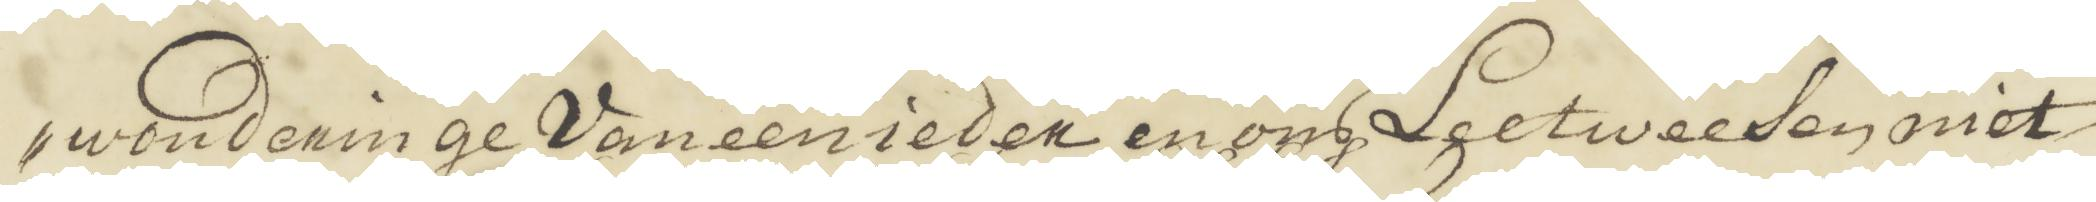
„wonderinge van een ieder en ons Leetweesen niet
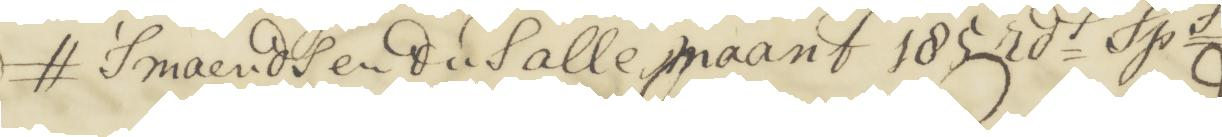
# 's maends en dus alle maant 185 rd=s sp=s
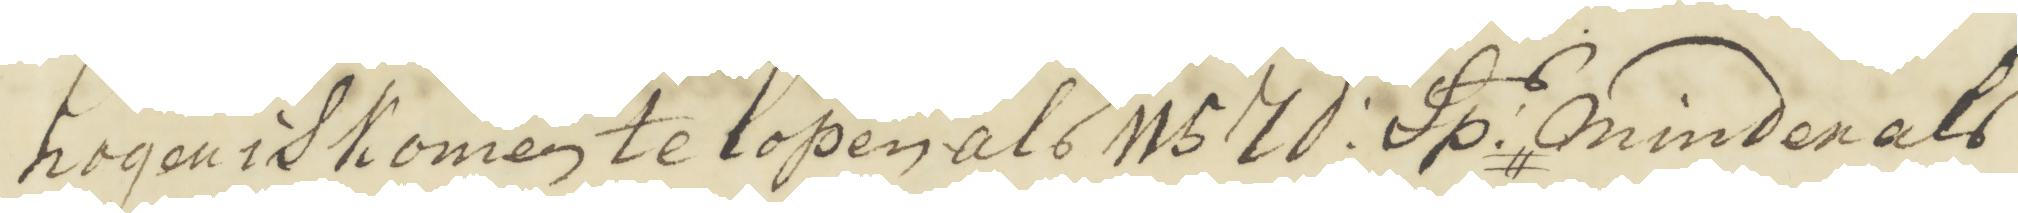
hoger is komen te lopen als 115 rd:s Sp:s # minder als
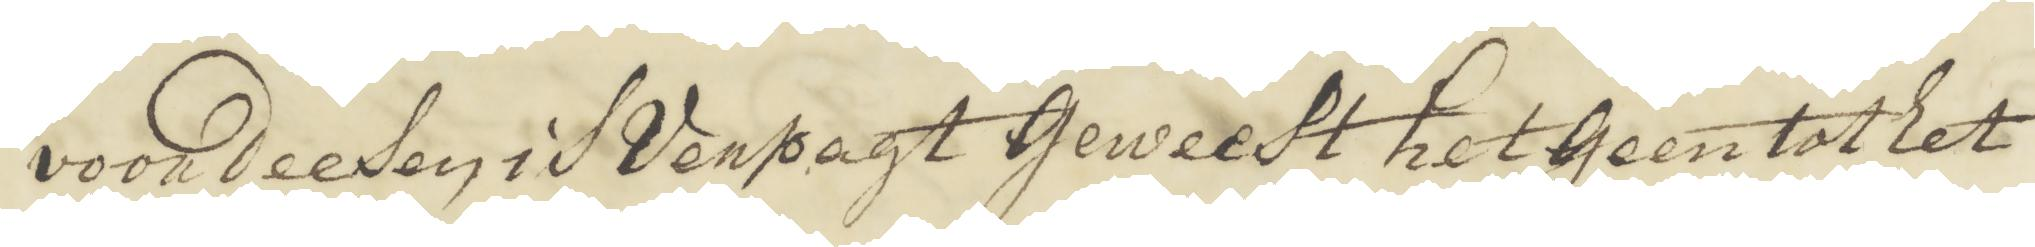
voor deesen is Verpagt geweest het geen tot het
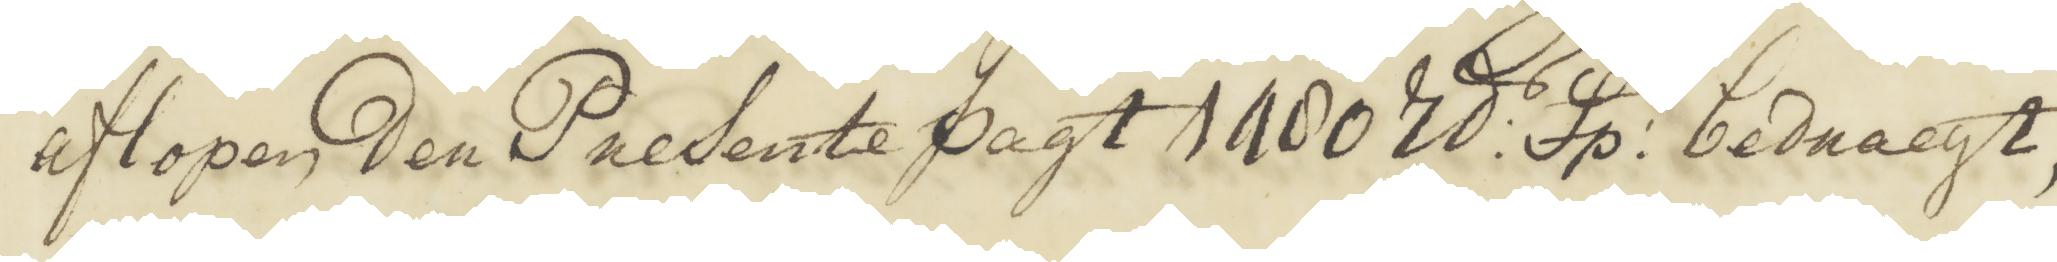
aflopen den Presente pagt 1480 rd:s Sp:s bedraegt
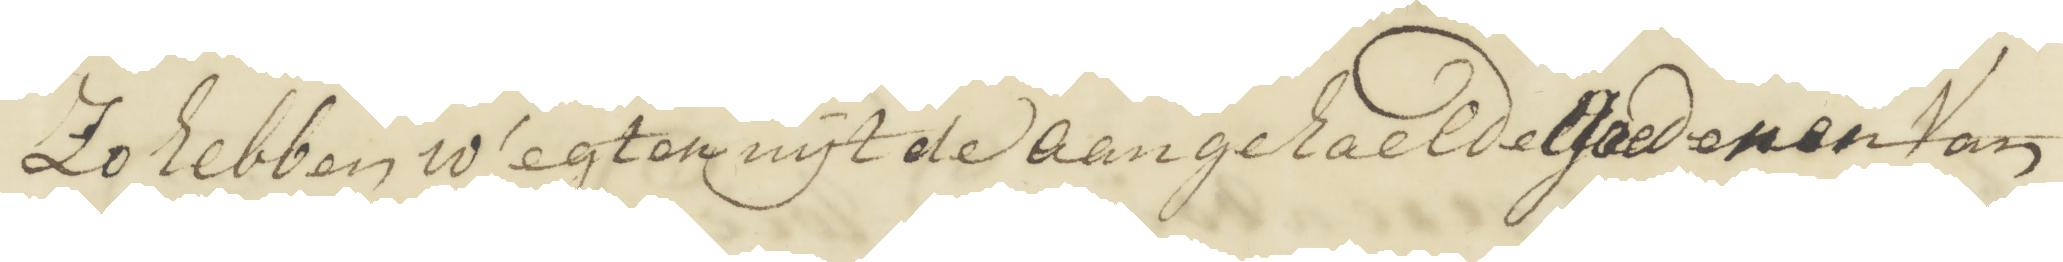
zo hebben w'egter uijt de aan gehaelde Goederen Van
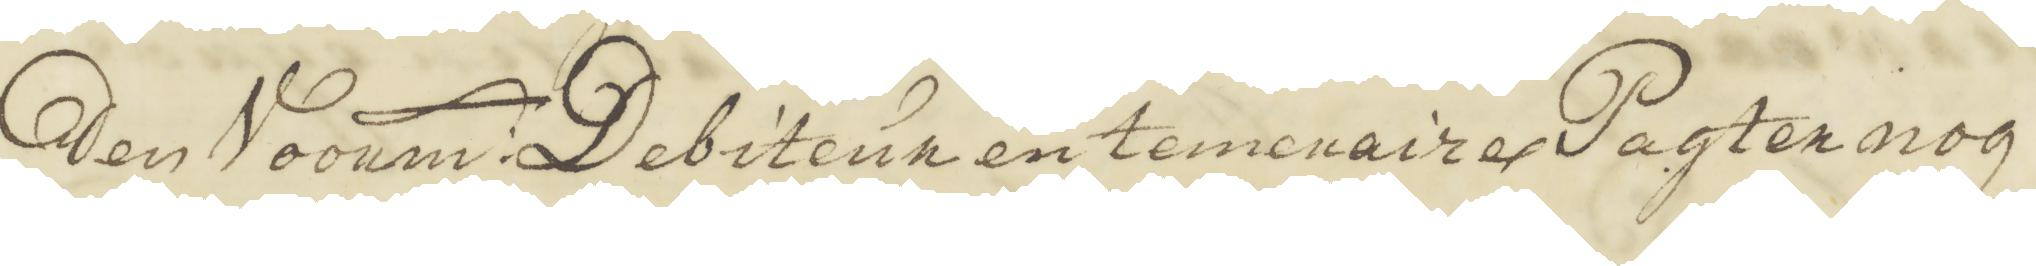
den Voorm: Debiteur en temeraire Pagter nog
